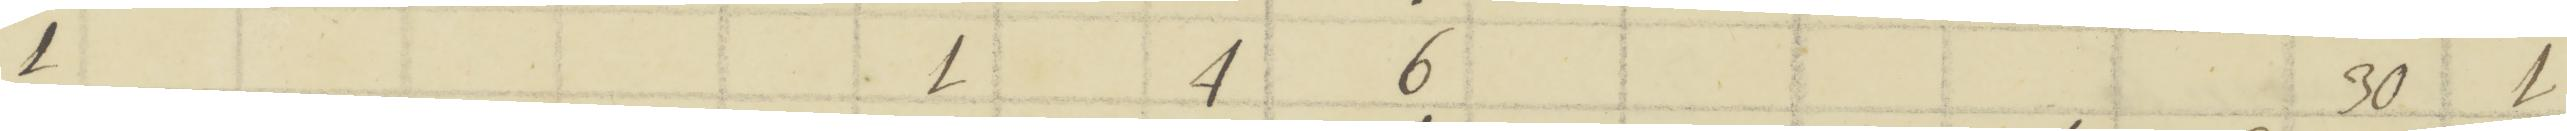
1 1 4 6 30 1
